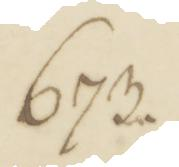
673.
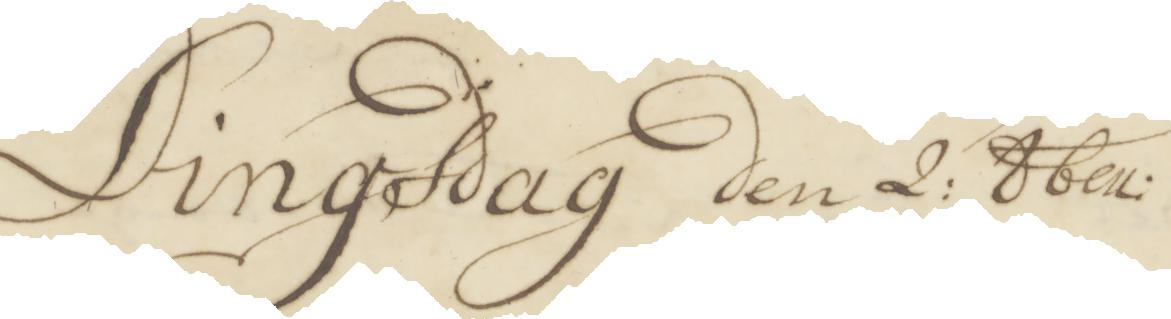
Dingsdag den 2:en 8ber:
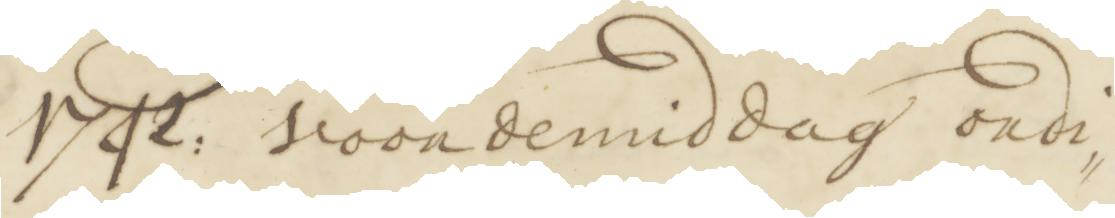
1742: voor de middag ordi„
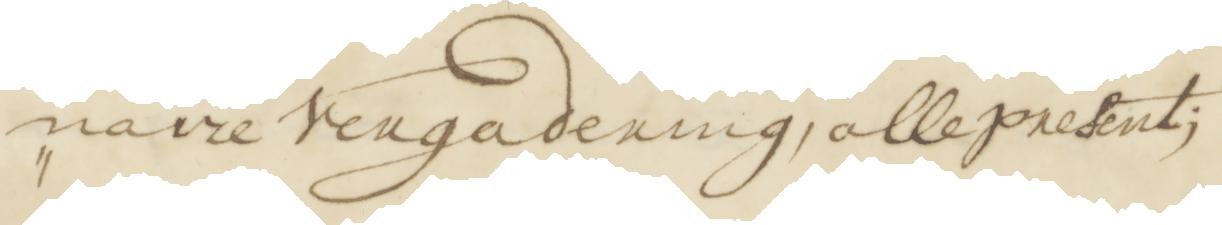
„naire vergadering, alle present;
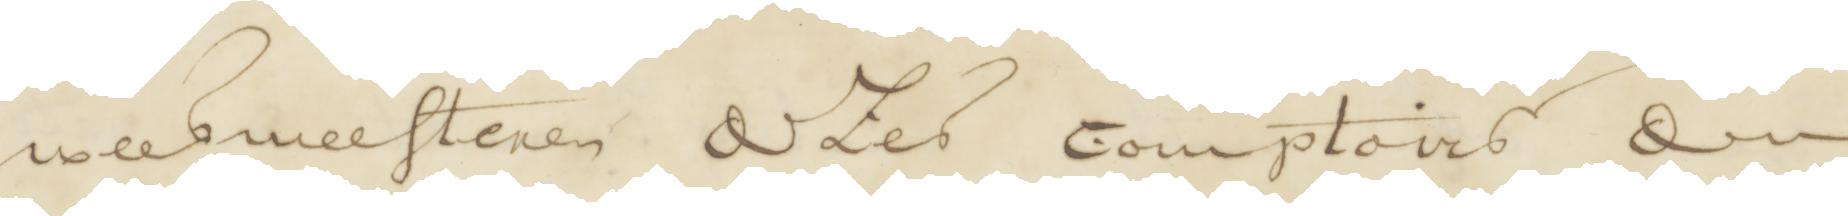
weesmeesteren dezes comptoirs den
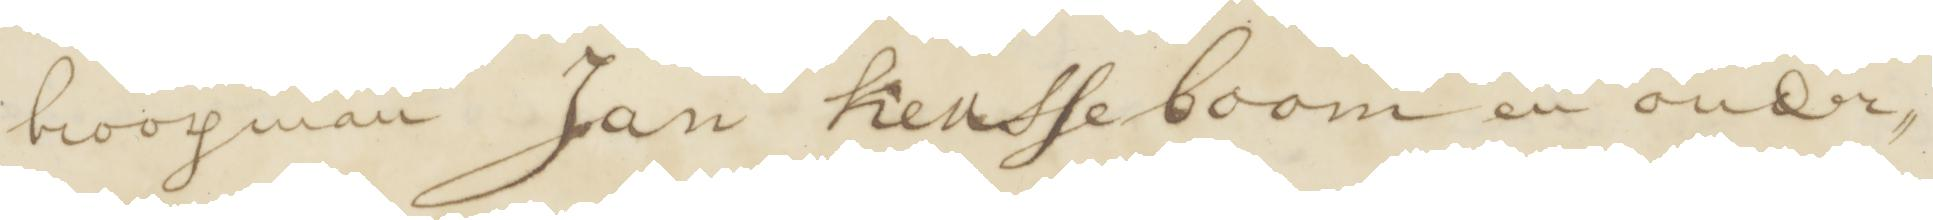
koopman Jan kersseboom en onder„
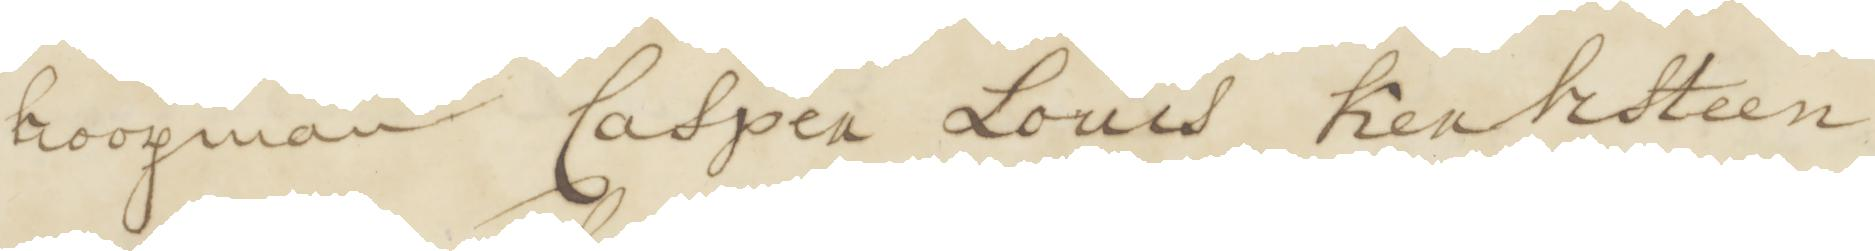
koopman Casper Louis kerksteen
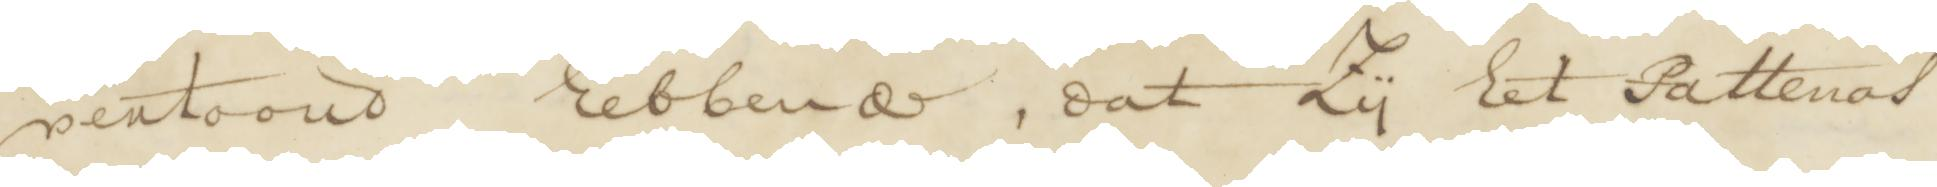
vertoond hebbende, dat Zij het Pattenas
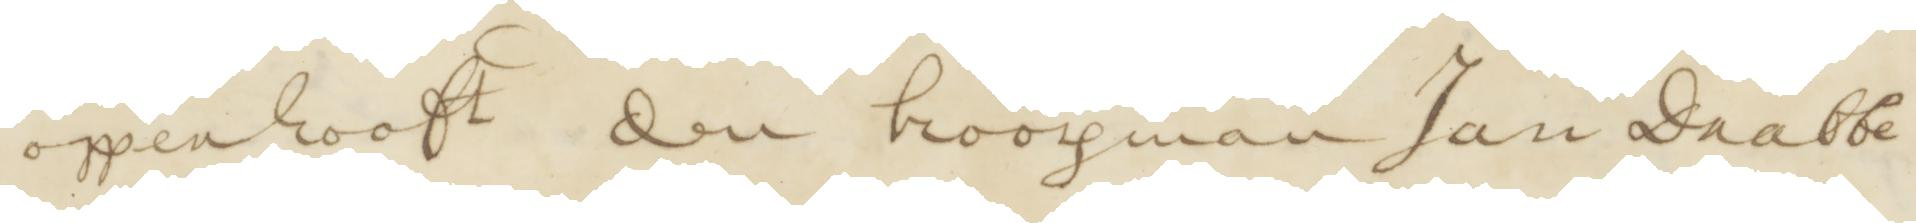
opperhooft den koopman Jan Drabbe
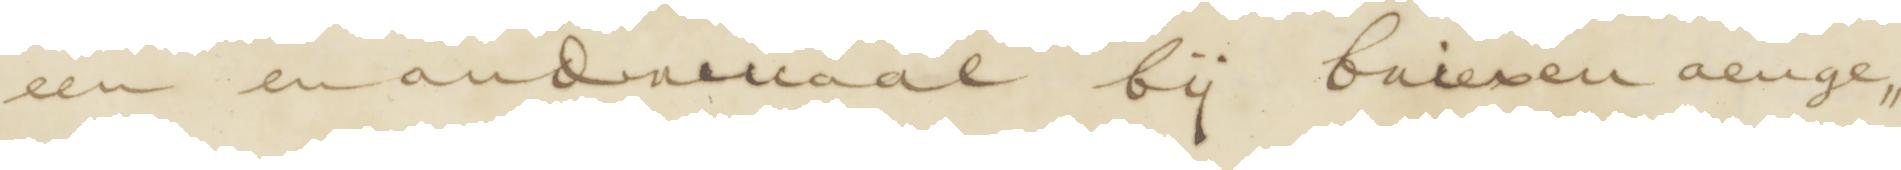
een en andermaal bij brieven aenge„
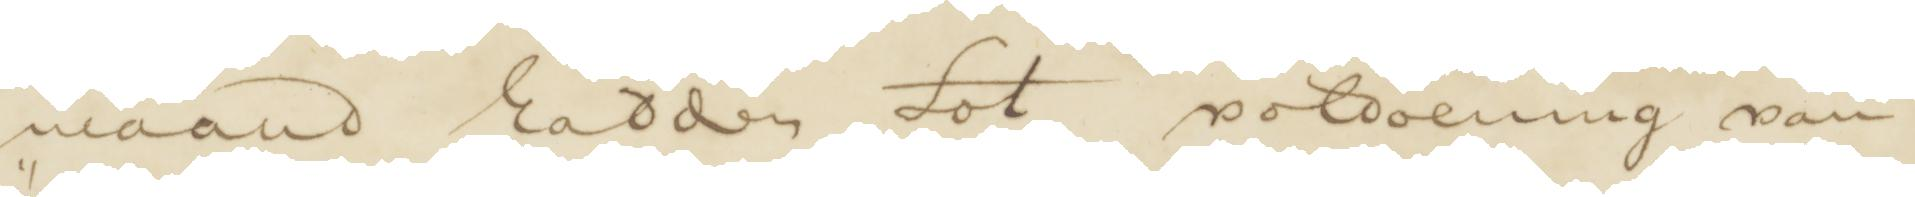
„maand hadden tot voldoening van
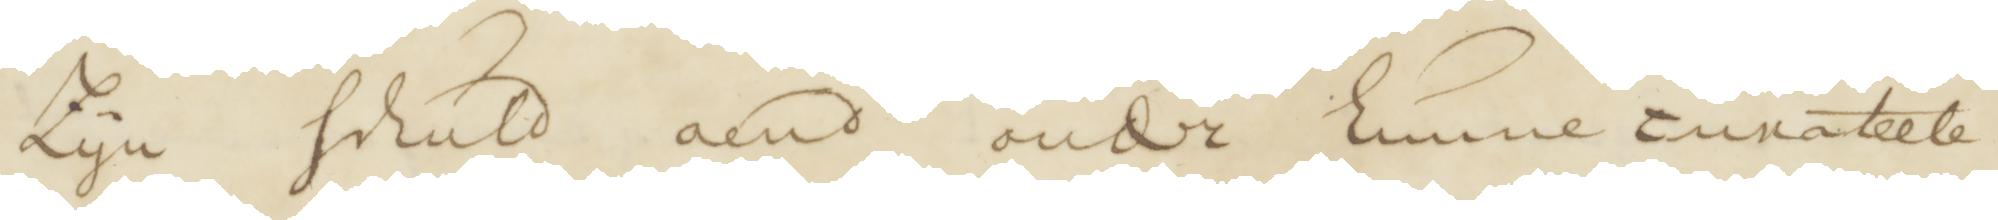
Zijn schuld aen d' onder hunne curateele
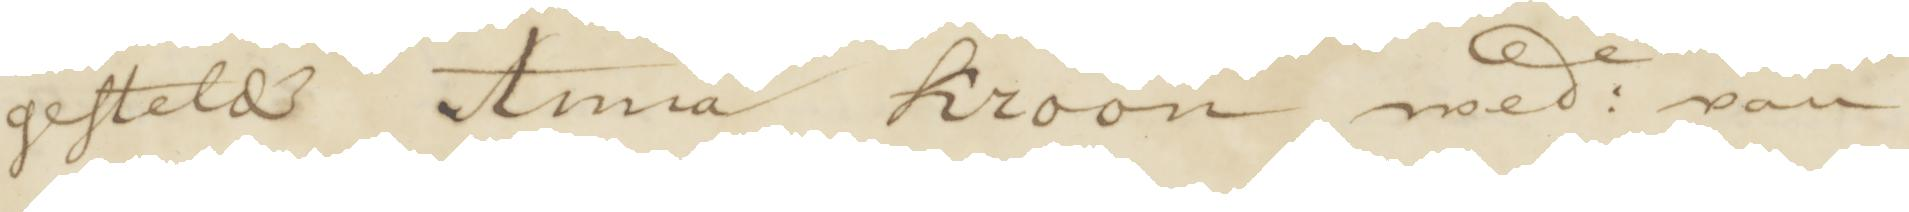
gestelde Anna kroon wed: van
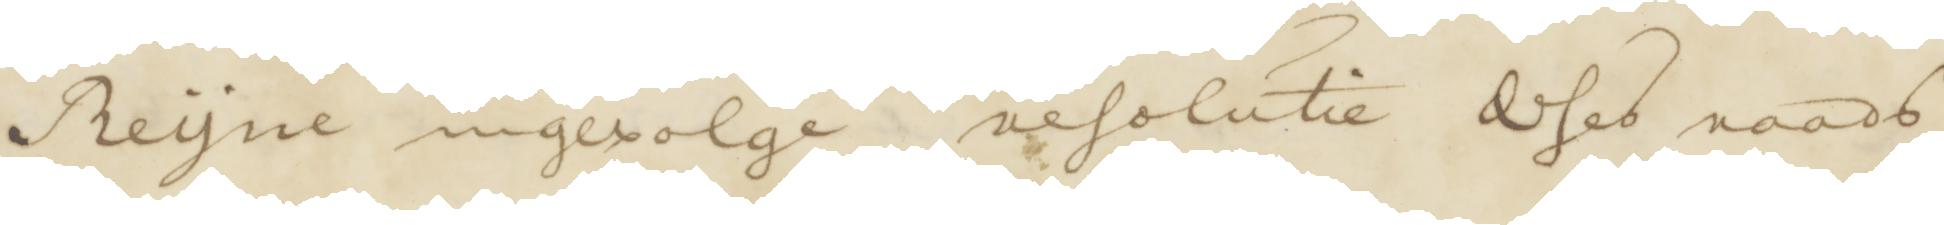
Reijne ingevolge resolutie deses raads
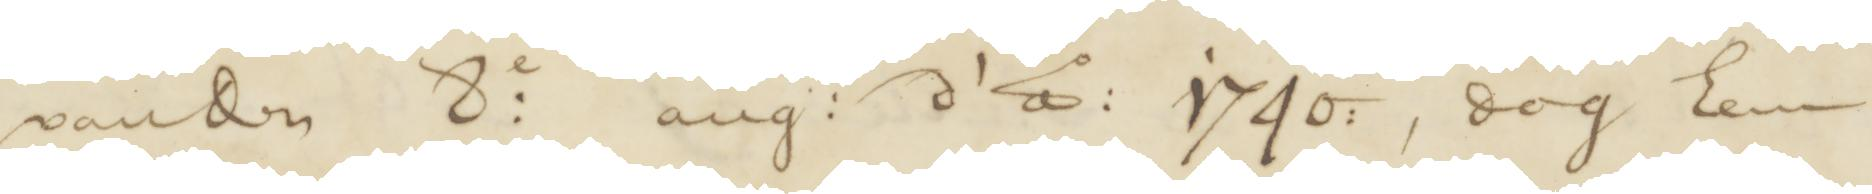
van den 8:e aug:s d' a:o 1740:, dog hem
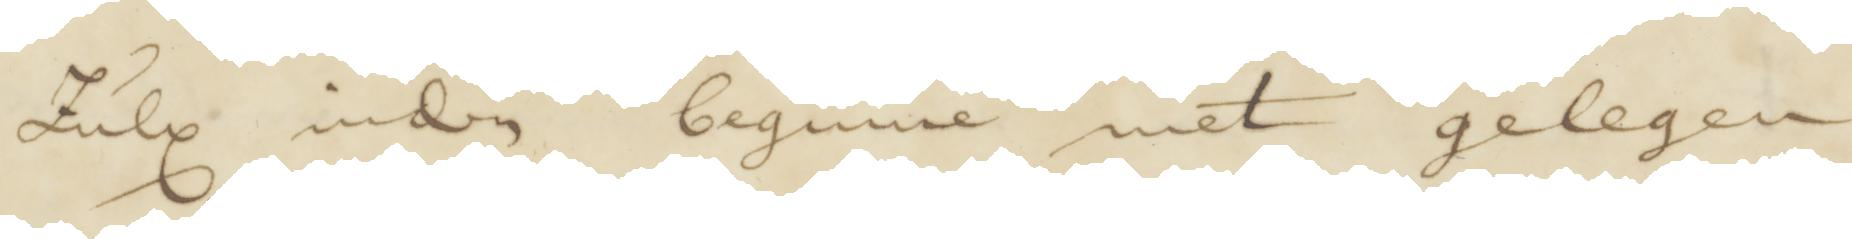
zulx inden beginne niet gelegen
